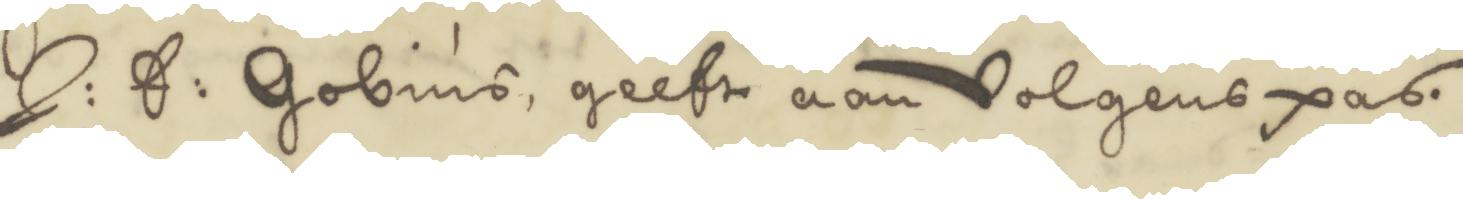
J: f: Gobius, geeft aan volgens pas.
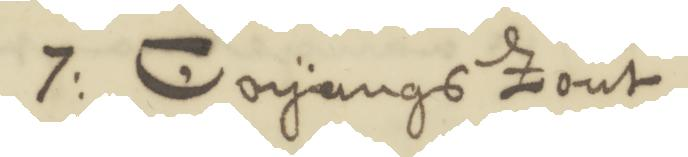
7: Coijangs zout
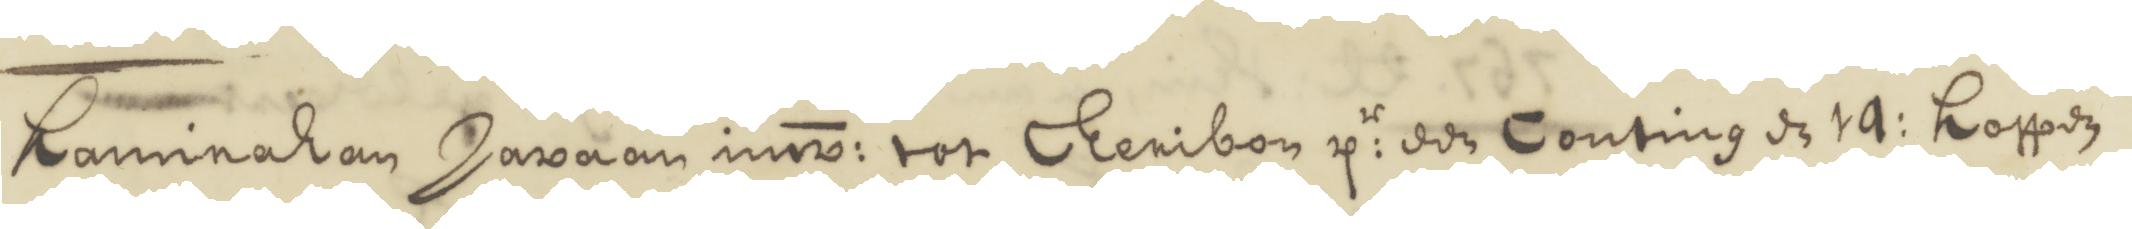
. 27: „ . kamirahan Javaan inw: tot Cheribon p:r een conting en 14: koppen
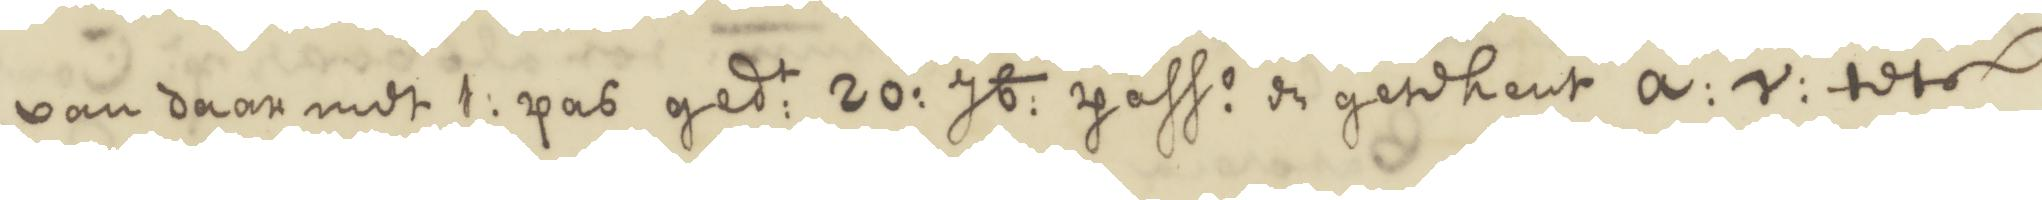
van daar met 1: pas ged:t 20: 7b: pass:o en getekent a: v: tets
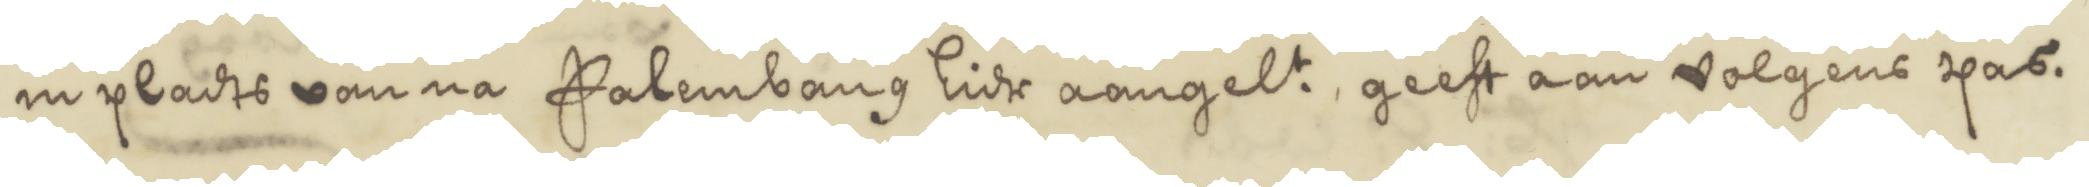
in plaets van na Palembang hier aangel.t geeft aan volgens pas.
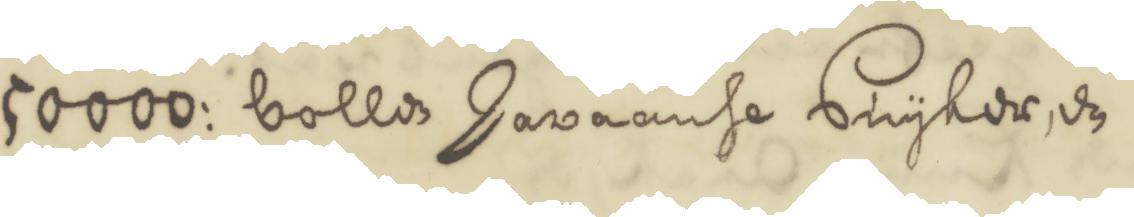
50000: bollen Javaanse Suijker, en
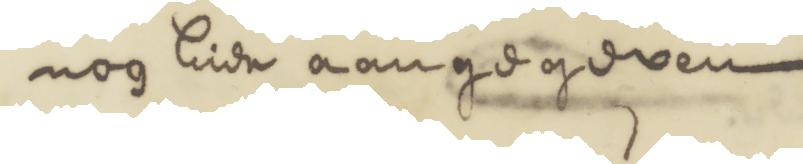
nog hier aangegeven
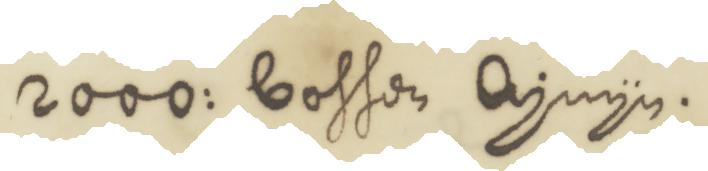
2000: bossen Ajuijn.
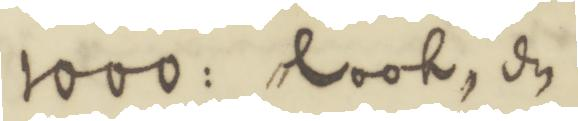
1000: „look„ en
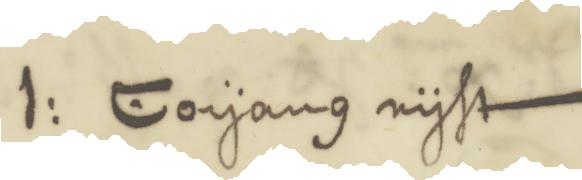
1: Coijang rijst.
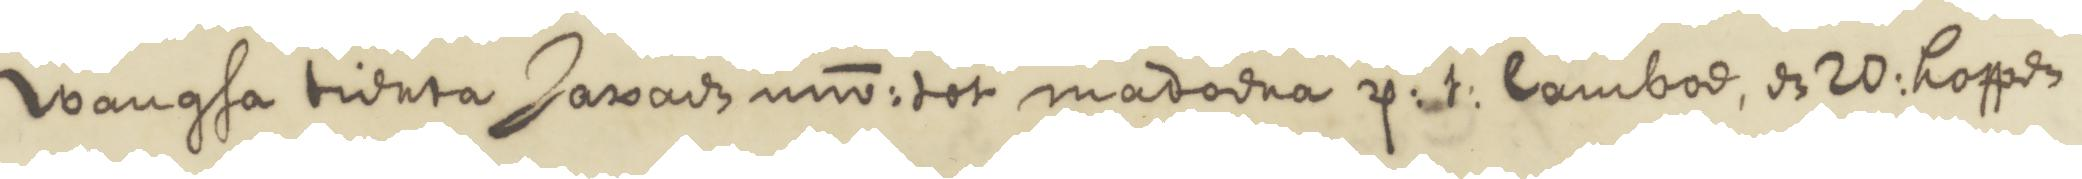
. „ . „ . wangsa tierta Javaen inw: tot madoera p:r 1: lamboe, en 20: koppen
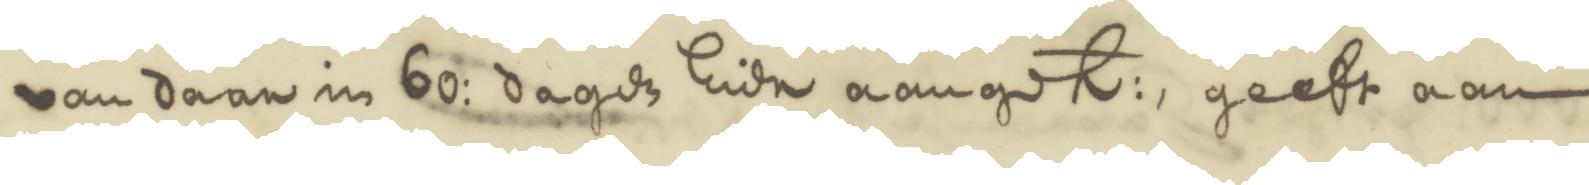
van daar in 60: dagen hier aangek:, geeft aan
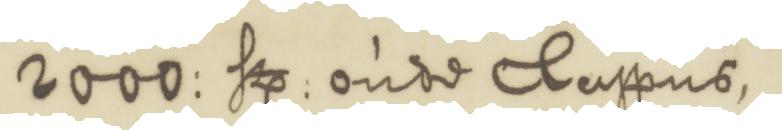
2000: stx: oude clappus,
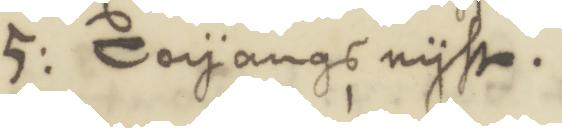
5: Coijangs rijst.
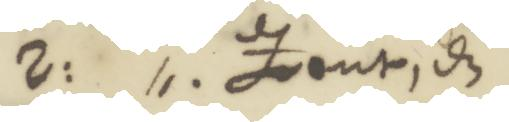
2: „. Zout, en
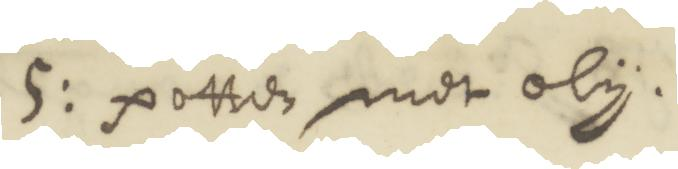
5: potten met olij.
